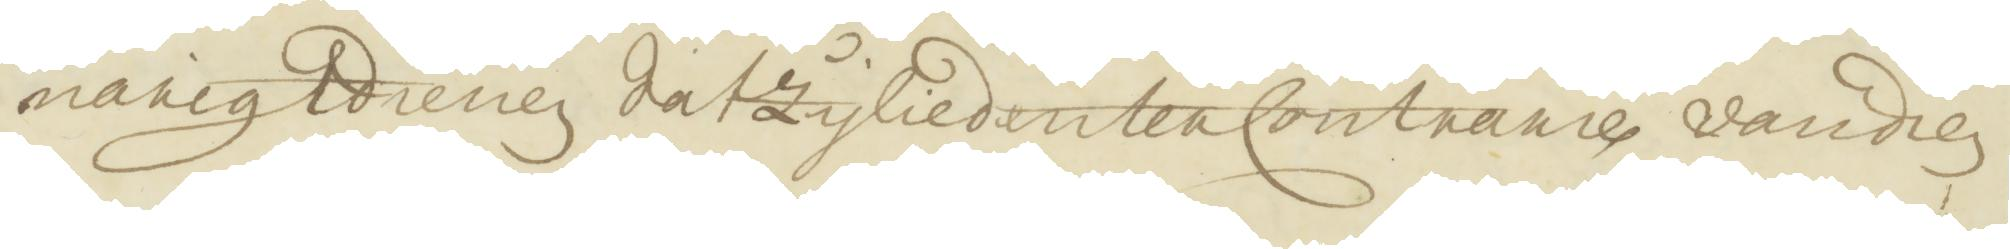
narigtdienen dat zijlieden ter contrarie van dien
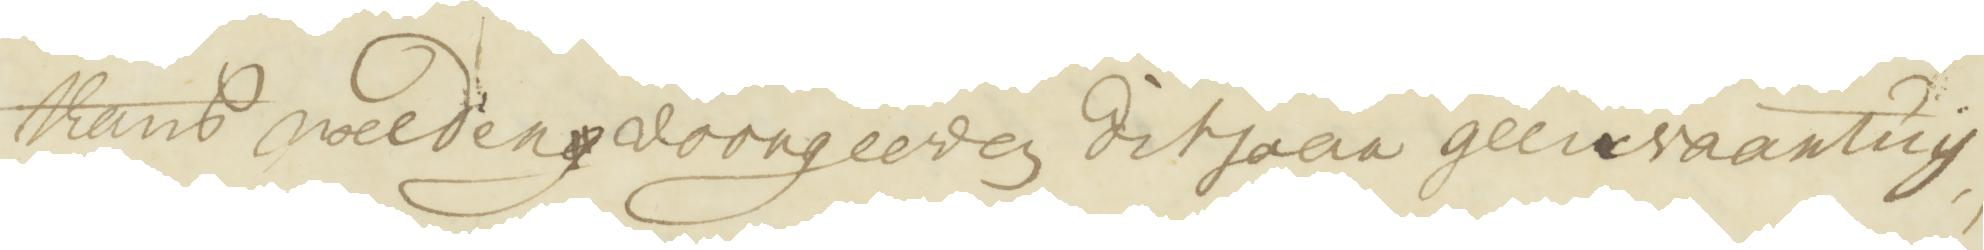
thans weeder gvoorgeeven dit jaar geen vaartuij„
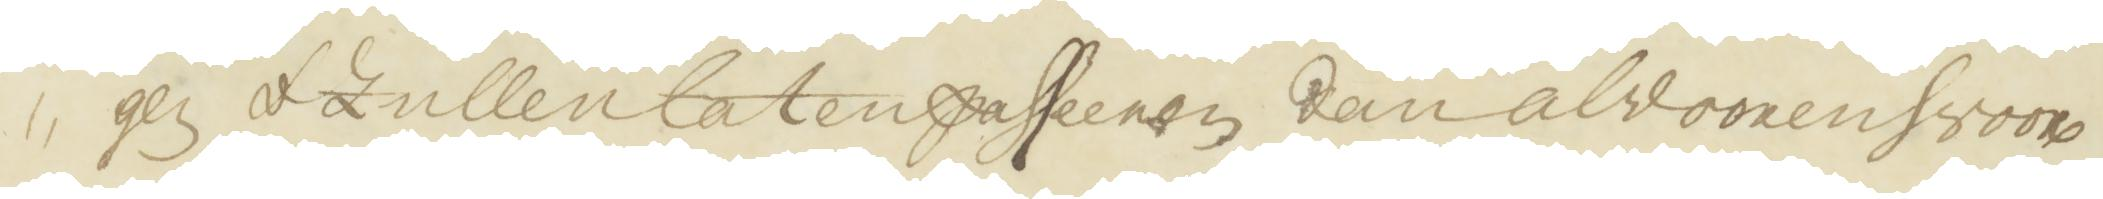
„gen te zullen laten passeeren dan alvoorens voor
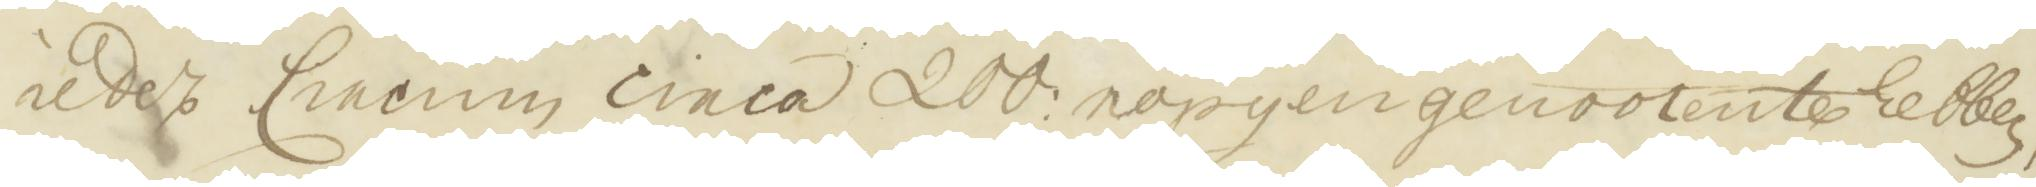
ieder Circum circa 200: ropijen genooten te hebben,
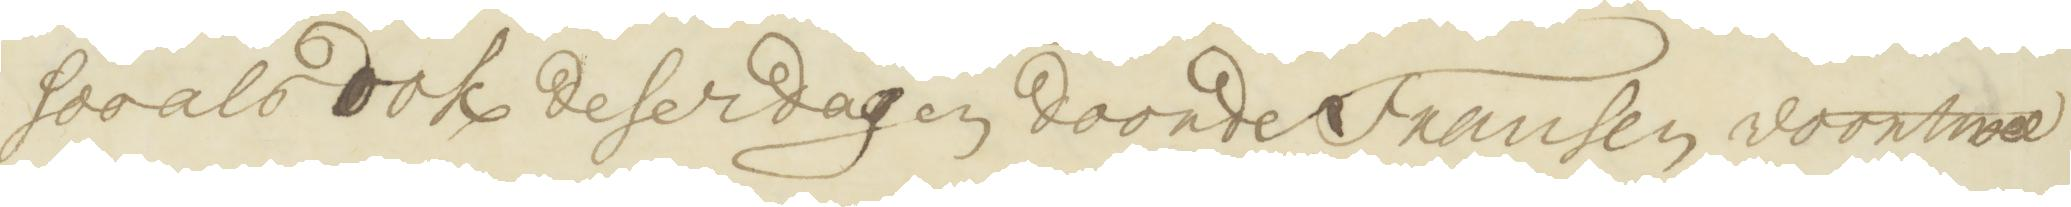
soo als ook deser dagen door de Fransen voor twee
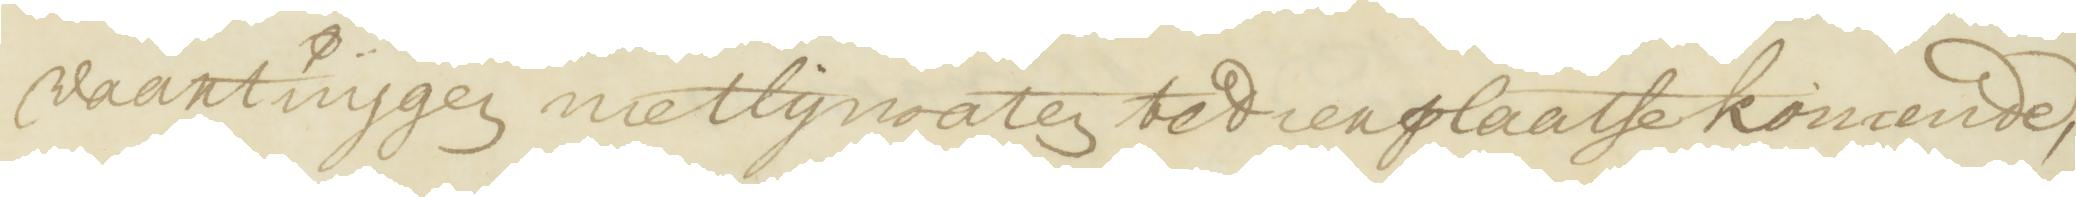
vaartuijgen met lijwaten te dier plaatse komende,
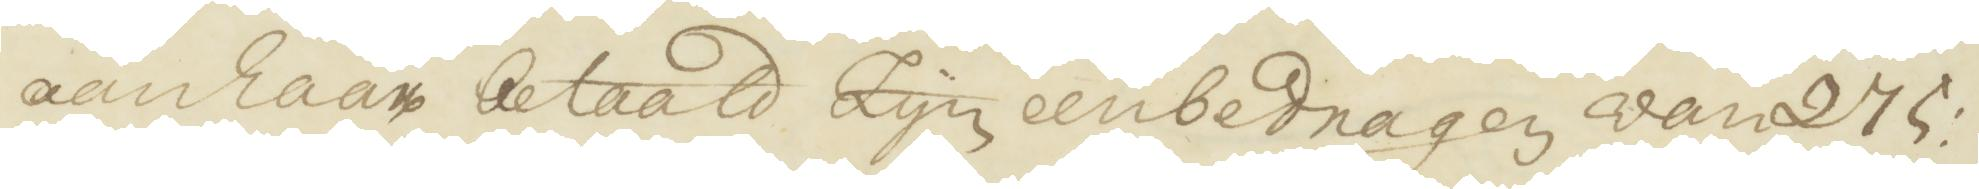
aan haar betaald zijn een bedragen van 275:
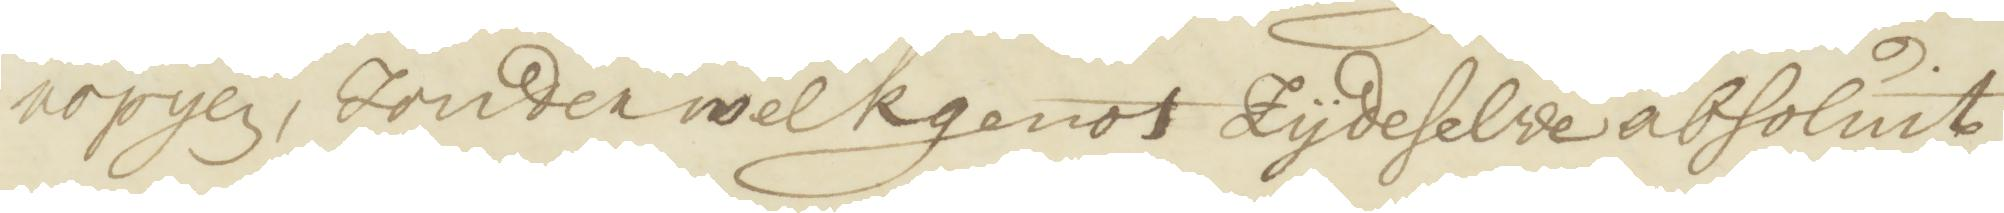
ropijen, zonder welk genot zij deselve absoluit
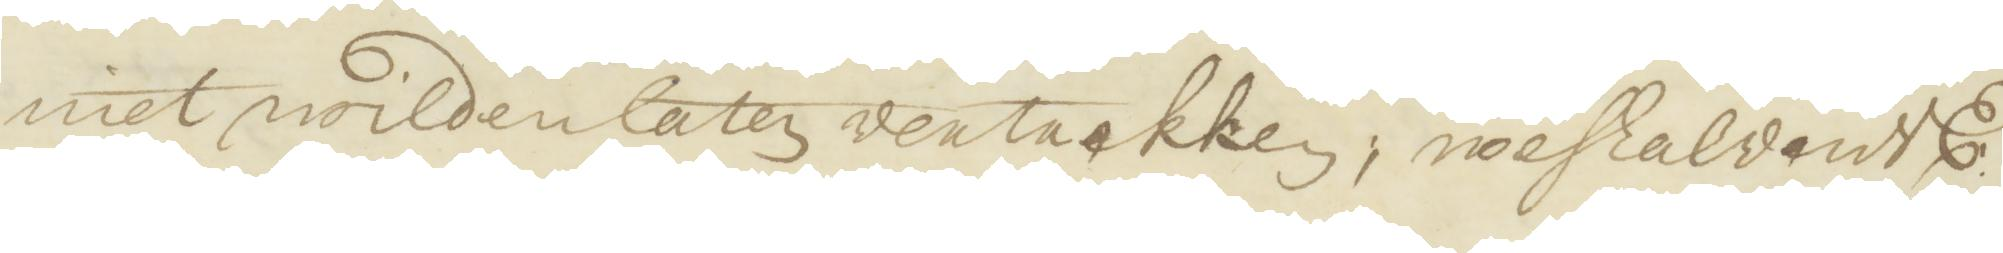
niet wilden laten vertrekken; weshalven VE:
